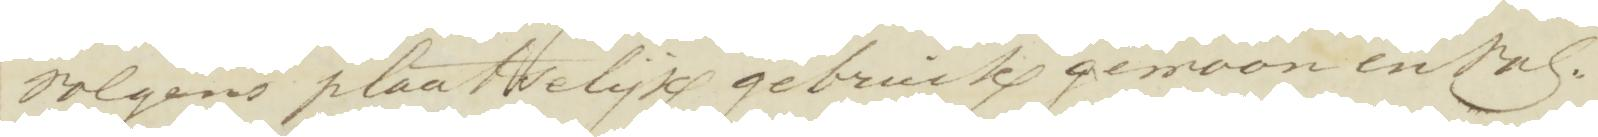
volgens plaatselijk gebruik gewoon en vol„
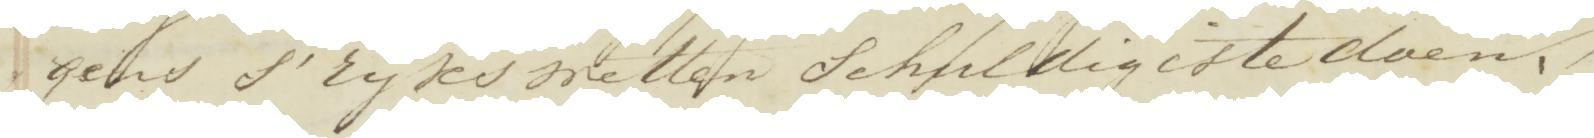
„gens s' rijks wetten schuldig is te doen,
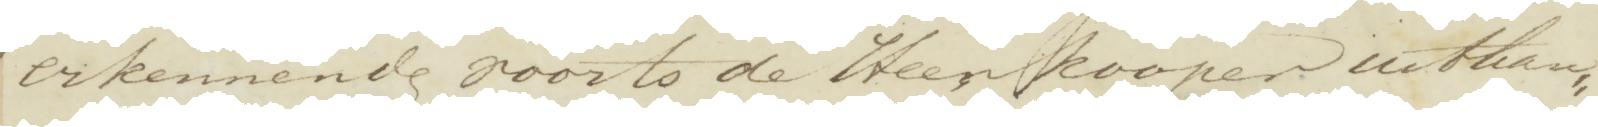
erkennende voorts de Heer kooper uithan„
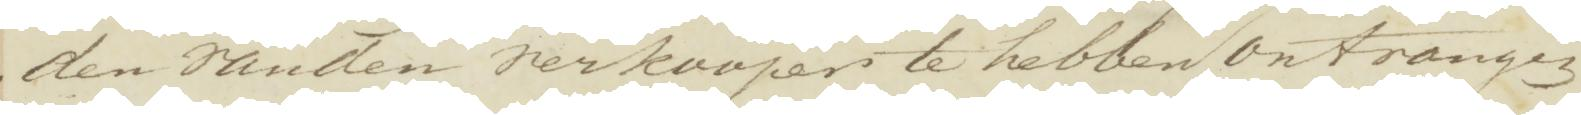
den van den verkooper te hebben ontvangen
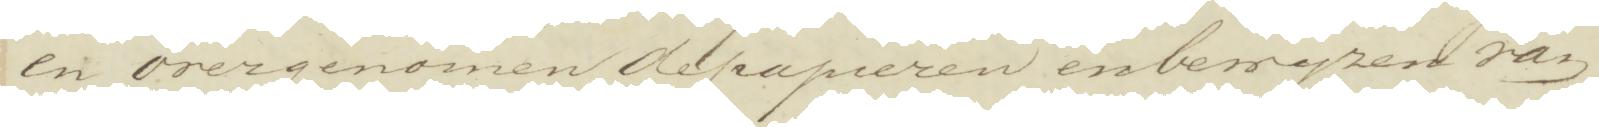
en overgenomen de papieren en bewyzen van
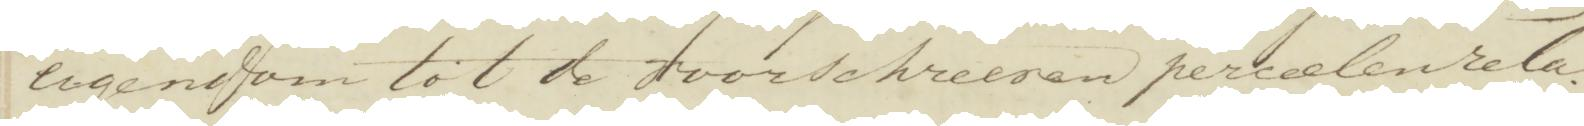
eigendom tot de voorschreeven perceelen rela„
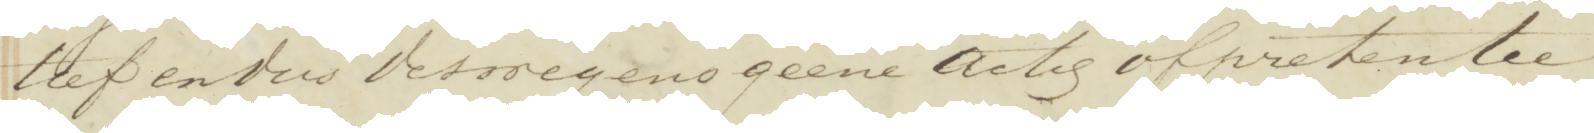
tief en dus deswegens geene actie of pretensie
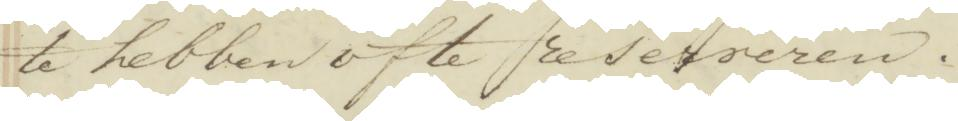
te hebben of te reserveren.
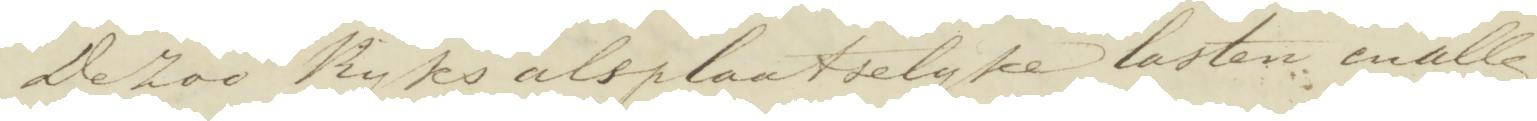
De zoo Ryks als plaatselyke lasten, en alle
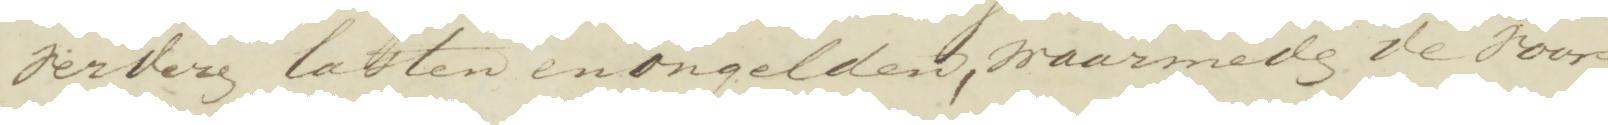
verdere lasten en ongelden, waarmede de voor
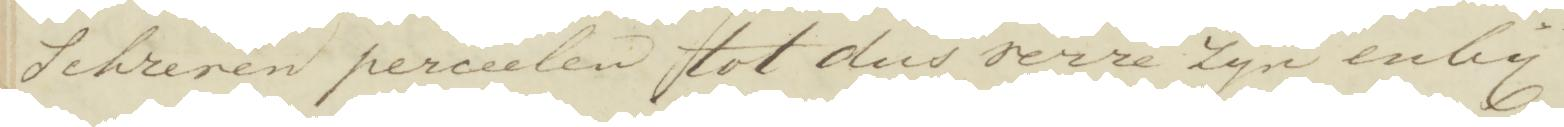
schreven perceelen tot dus verre zijn en bij
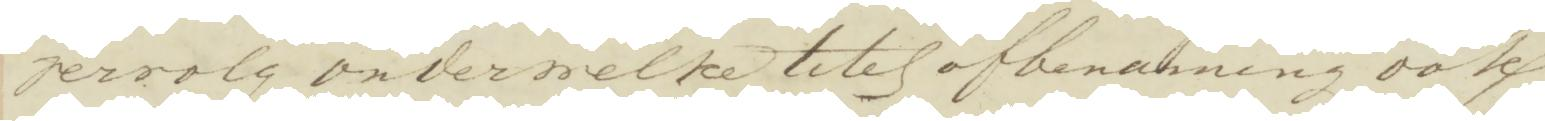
vervolg onderwelke titel of benaming ook
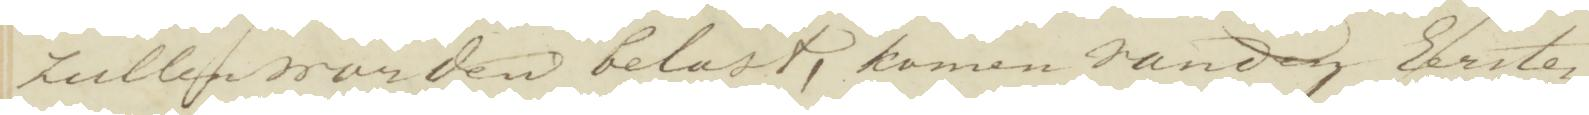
zullen worden belast, komen van den Eersten„
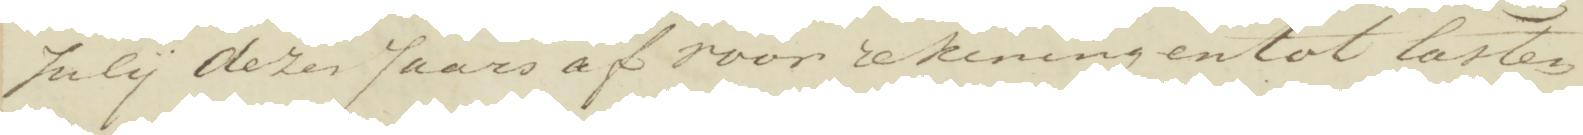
Julij dezes Jaars af voor rekening en tot lasten
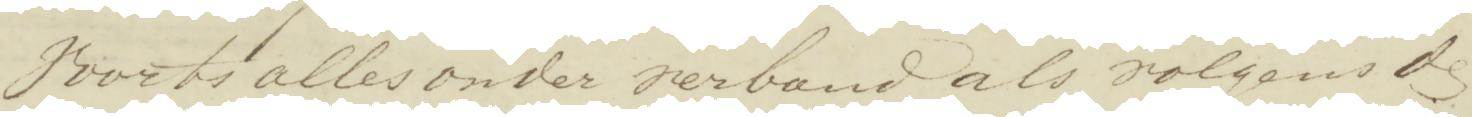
Voorts alles onder verband als volgens de
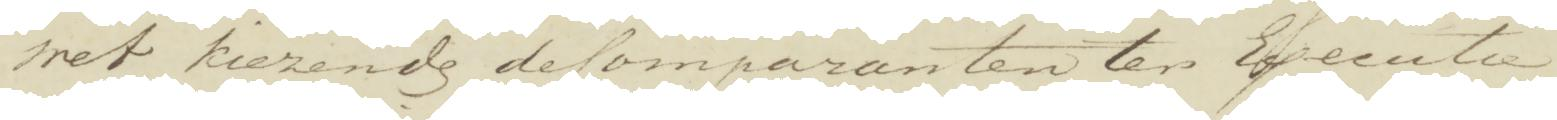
wet kiezende de comparanten ter Executie
